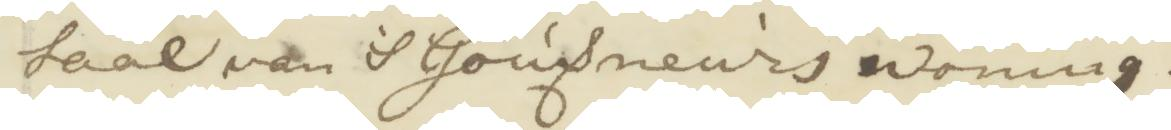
saal van 's Gouverneurs woning.
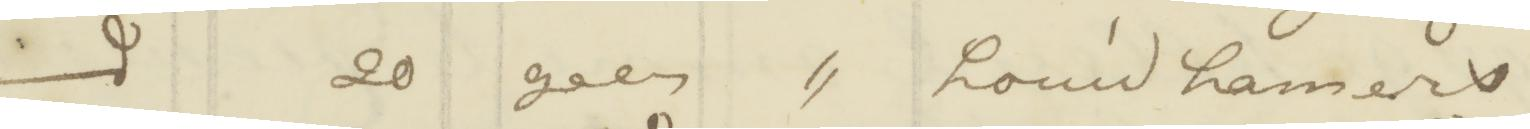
_o 20 geen „ houw hamers
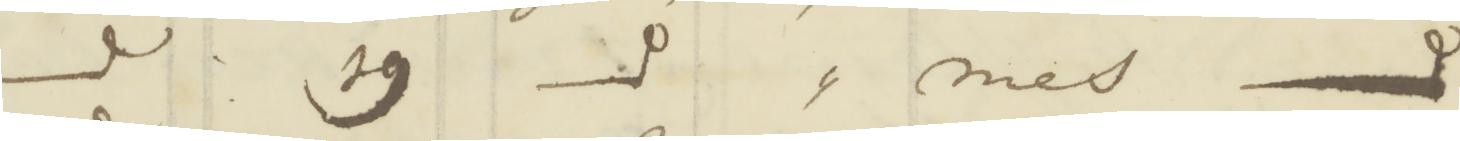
_o 19 _o „ mes _o
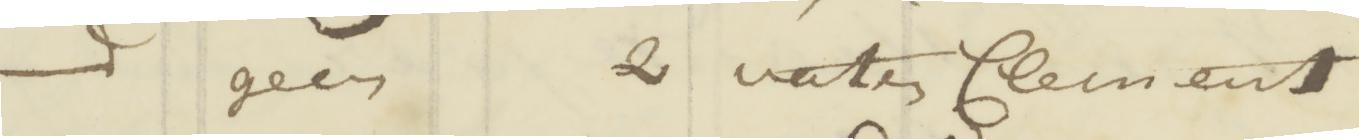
_o geen 2 vaten Clement
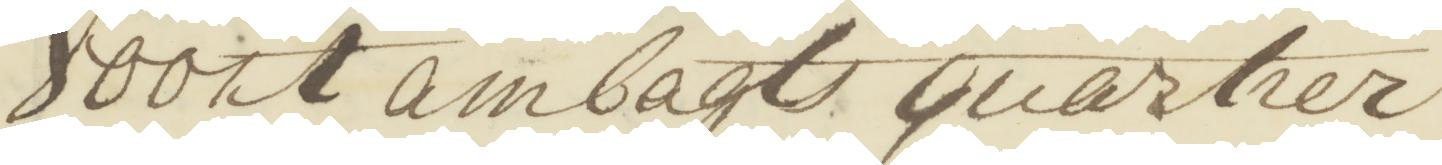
Voor't ambagts quartier
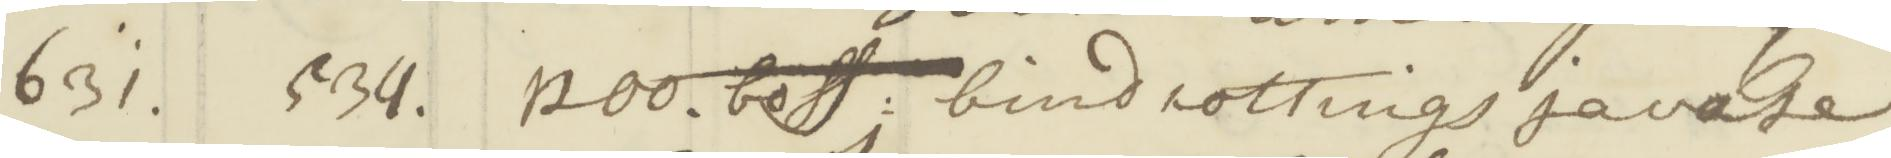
631. 534. 1200. boss: bindrottings javase
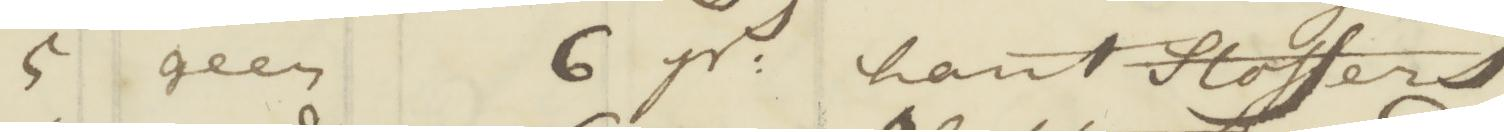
5 geen 6 p:s hant stoffers
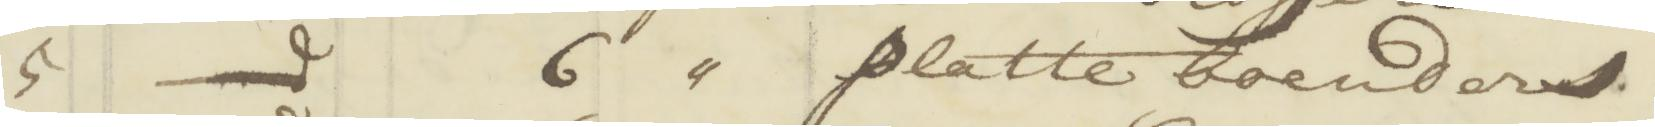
5 _o 6 „ platte boenders
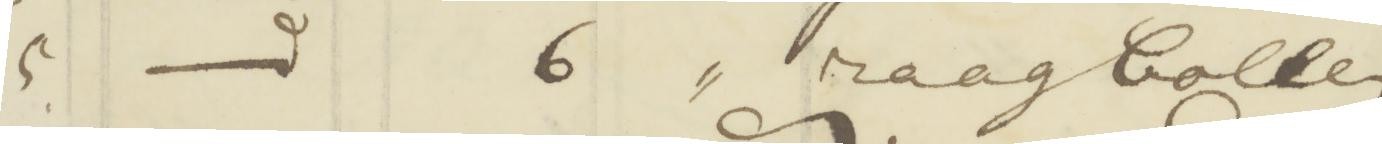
5 _o 6 „ raagbollen
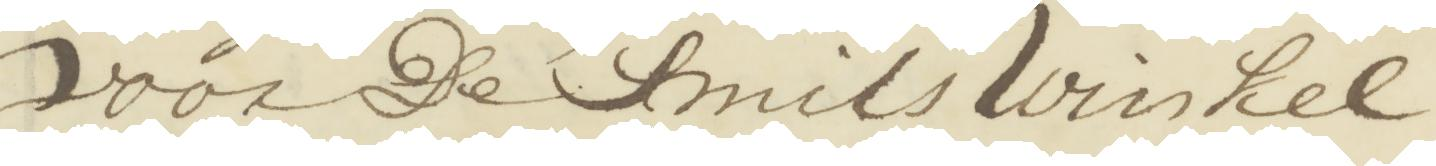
Voor De Smits Winkel
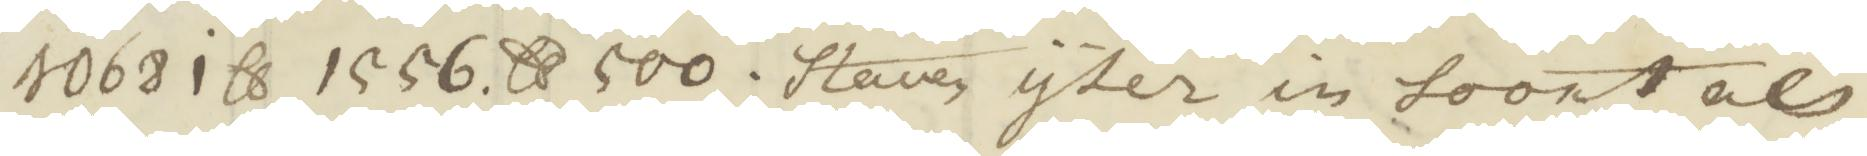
10681 lb 1556. lb 500. staven ijser in soort als
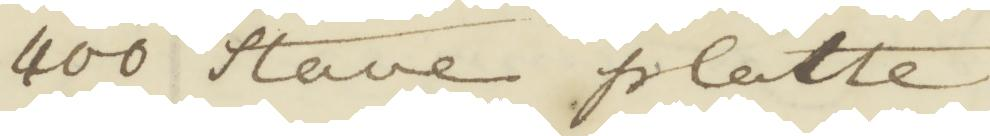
400 stave platte
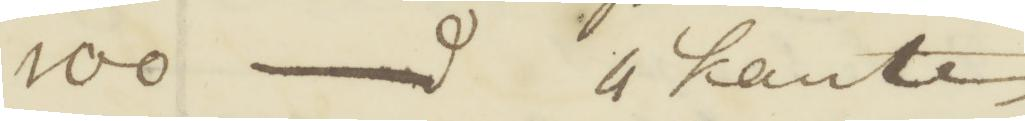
100 _o 4 kanten
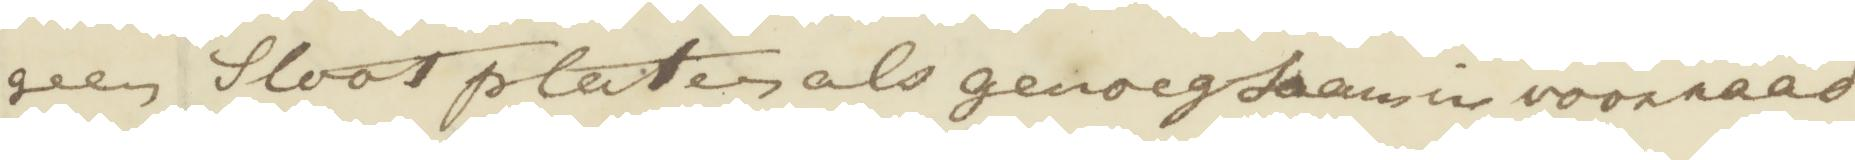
geen sloot platen als genoegsaam in voorraad
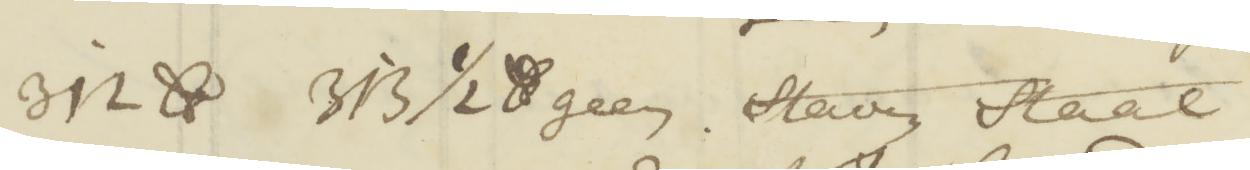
312 lb 313½ lb geen. staven staal
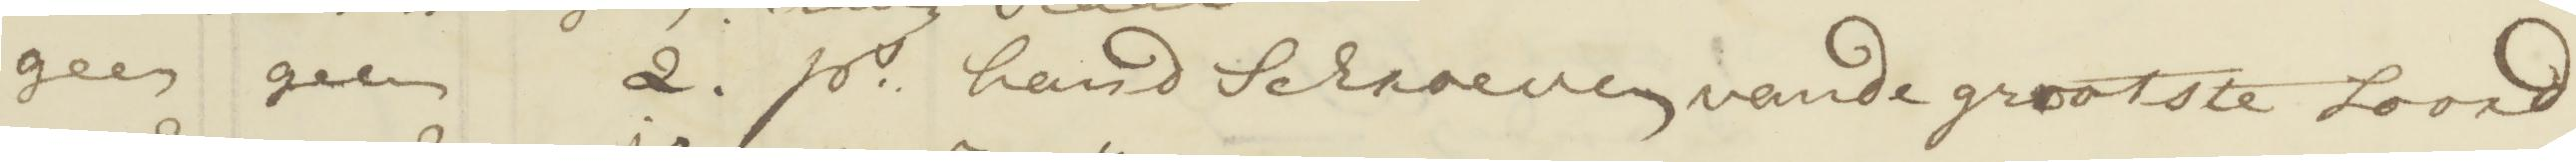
geen geen 2. p„s hand schroeven vande grootste soord
